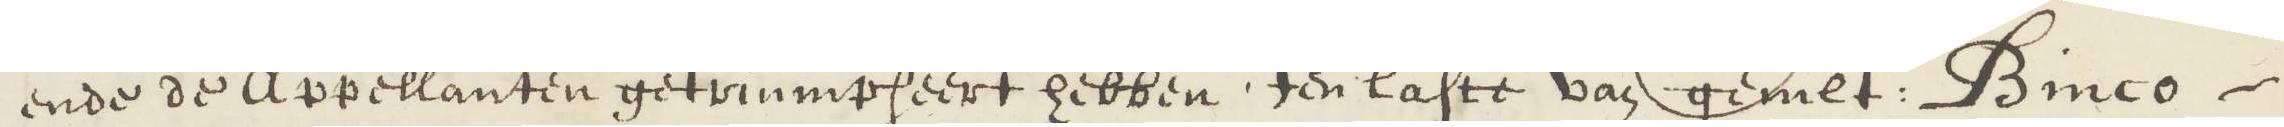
ende de appellanten getriumpheert hebben, ten laste van gemelt:n Binco —
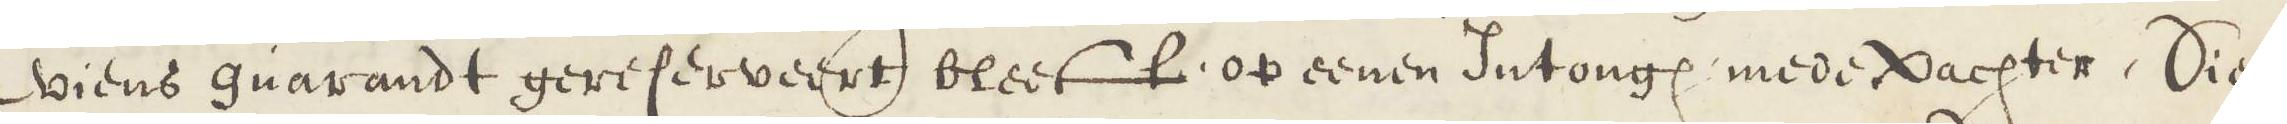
wiens guarandt gereserveert bleeff, op eenen Intongh mede pachter, die
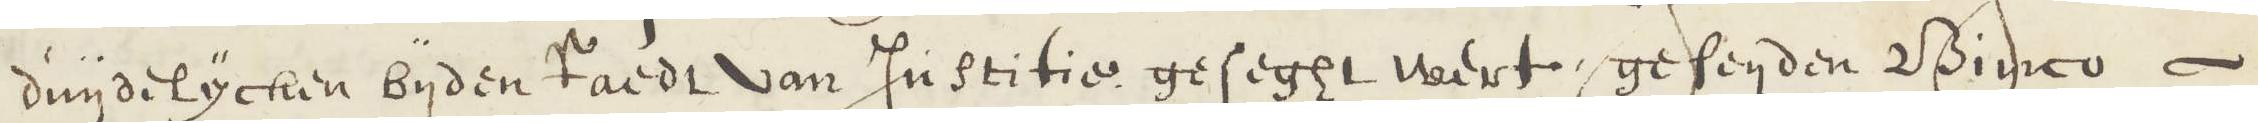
duijdelijcken bij den Raedt van Justitie geseght wert, geseyden Binco —
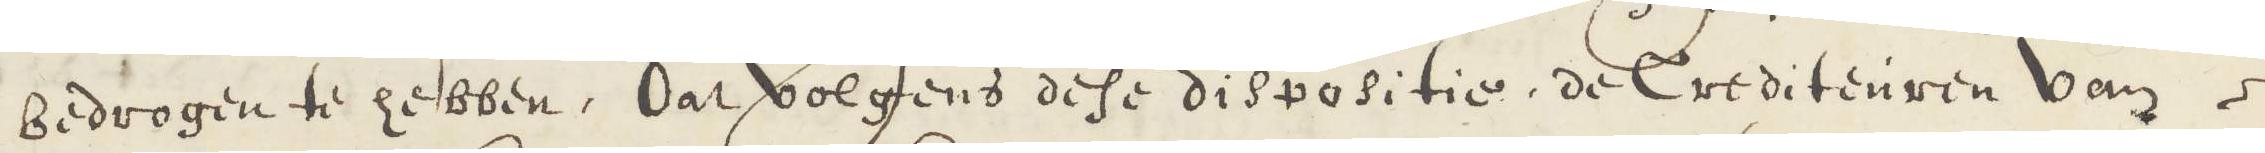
bedrogen te hebben, dat volgens dese dispositie, de Crediteuren van —
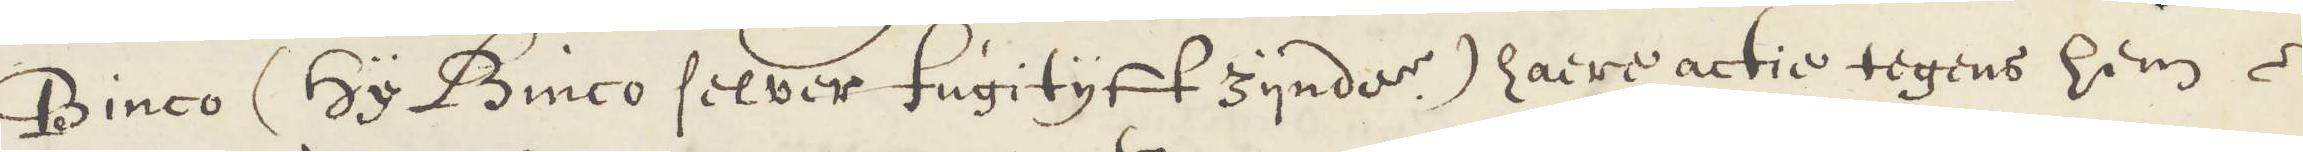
Binco ( hij Binco selver fugitijff zijnde. ) haere actie tegens hem —
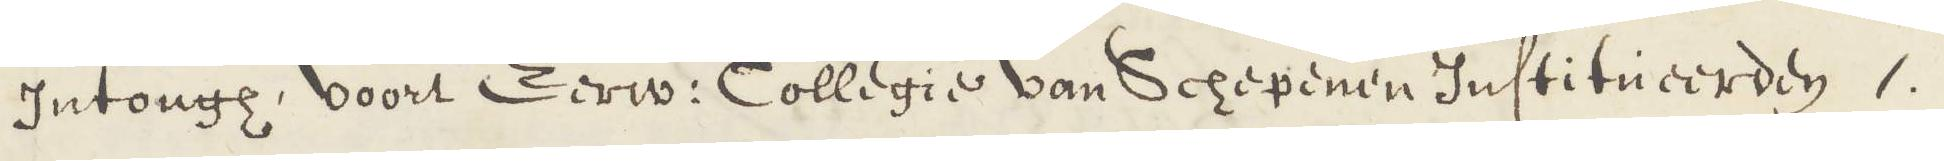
Intongh, voort Eerw: Collegie van Schepenen Institueerden /.
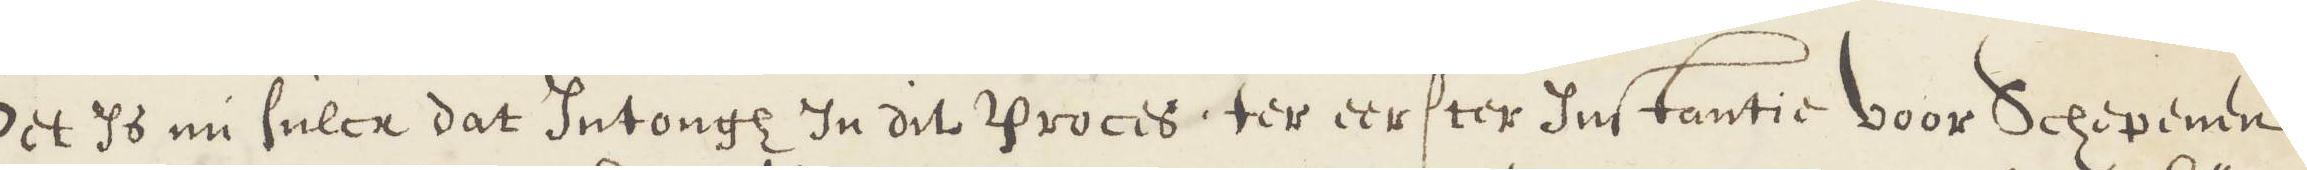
Het Is nu sulcx dat Intongh In dit proces ter eerster Instantie voor schepenen
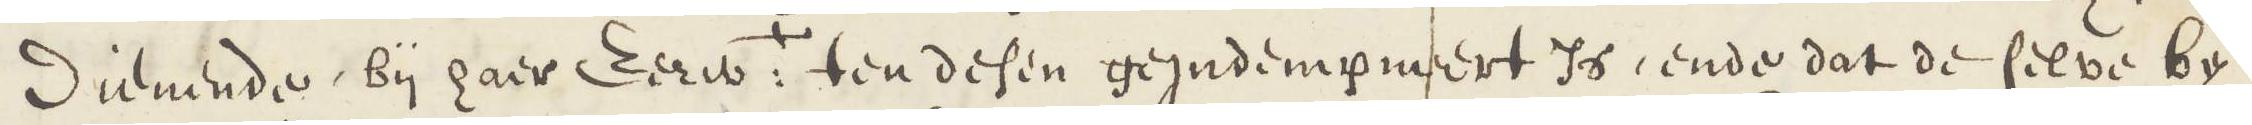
Dienende bij haer Eerw:t ten desen gejndempneert Is, ende dat de selve bij
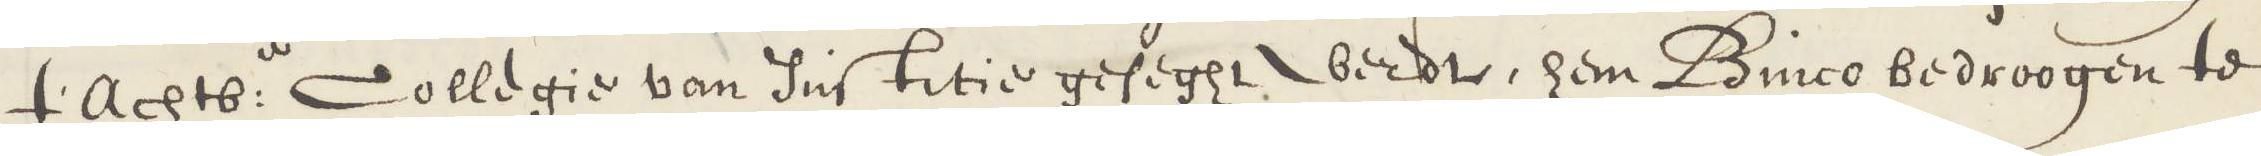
t' achtb: Collegie van Iustitie geseght werdt, hem Binco bedroogen te
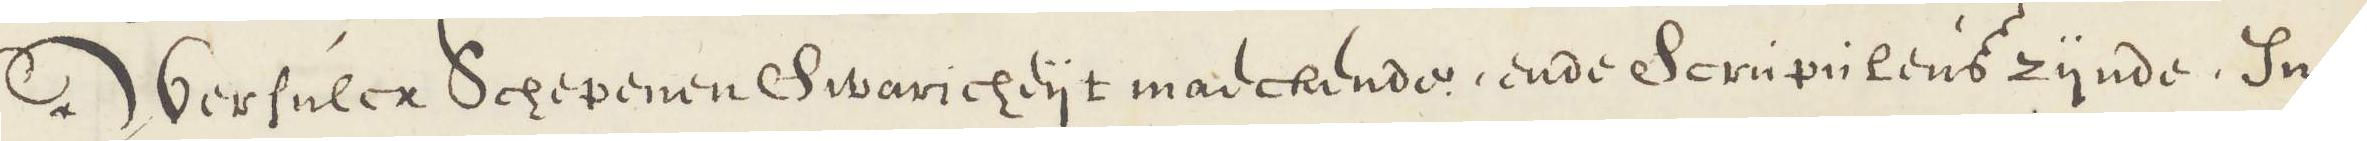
Oversulcx schepenen swaricheijt maeckende, ende scrupulens zijnde, In
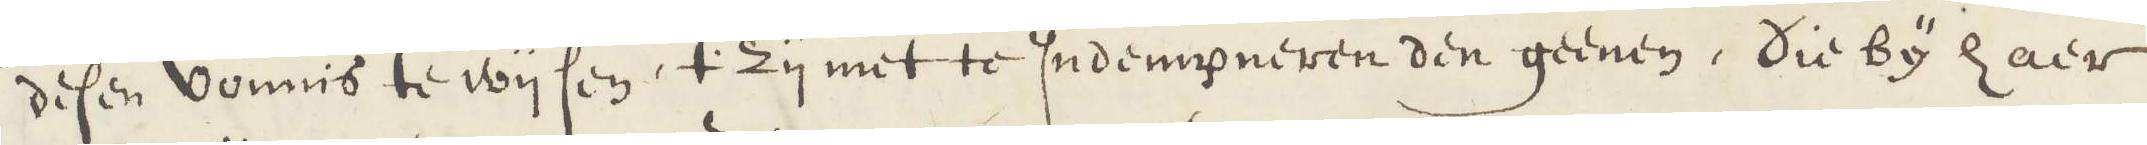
desen vonnis te wijsen, t' zij met te Jndempneren den geenen, die bij haer
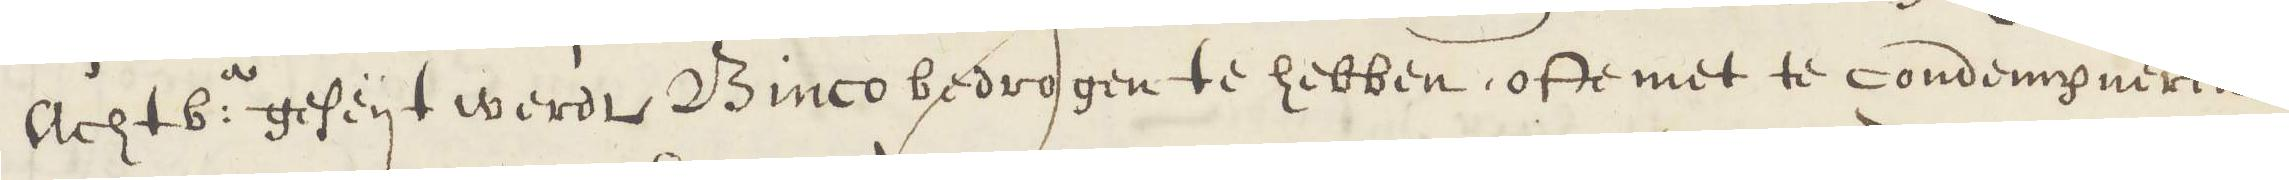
achtb:e geseijt werdt Binco bedrogen te hebben, ofte niet te condempneren
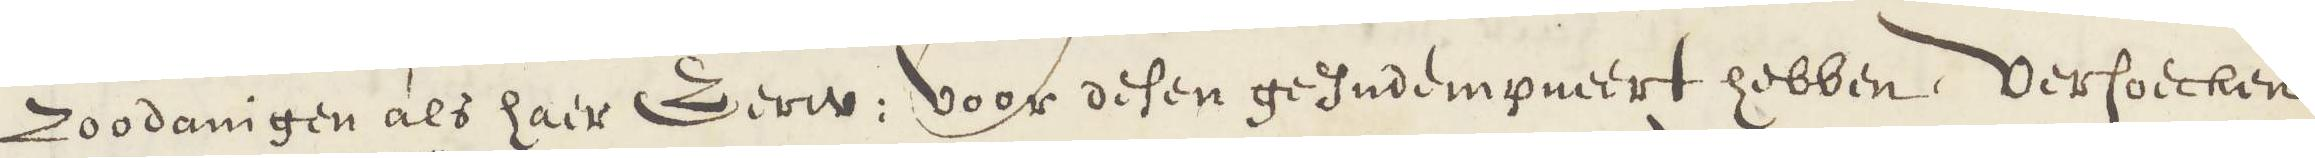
zoodanigen als haer Eerw: voor desen geindempneert hebben, versoecken
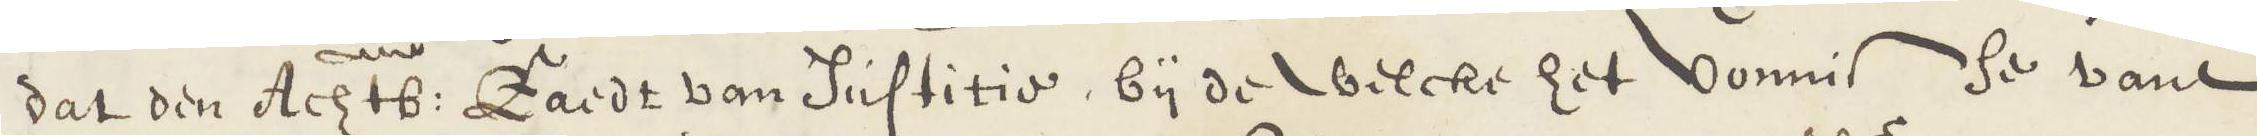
dat den Achtb: Raedt van Iustitie, bij de welcke het vonnisse vant
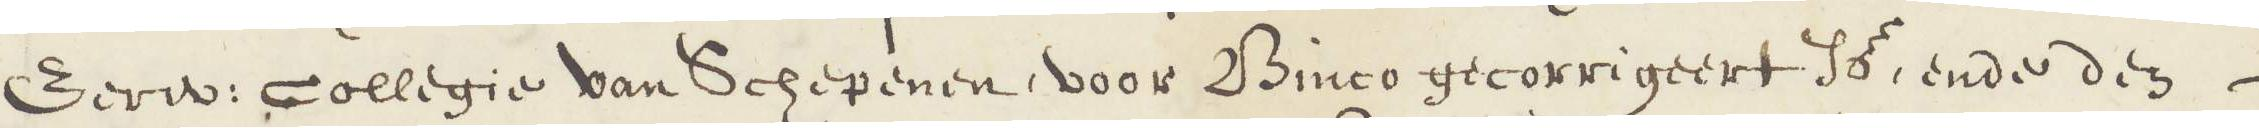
Eerw: collegie van Schepenen, voor Binco gecorrigeert Is, ende den
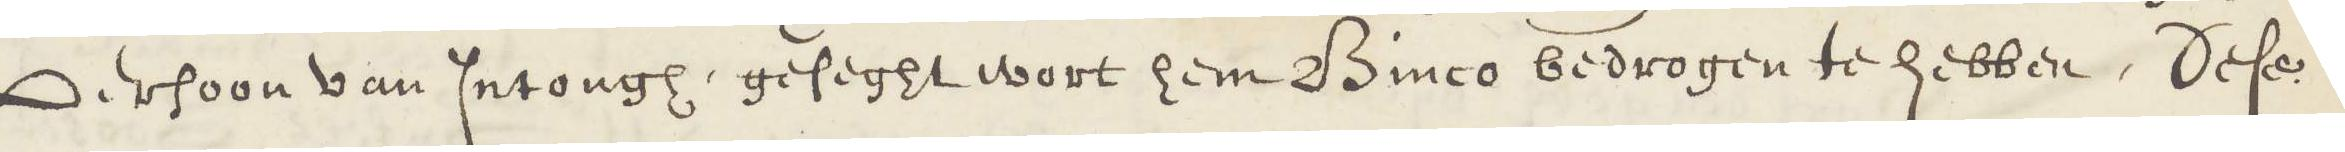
persoon van Jntongh, geseght wort hem Binco bedrogen te hebben, dese.
